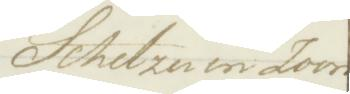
Schetzer en Zoon
